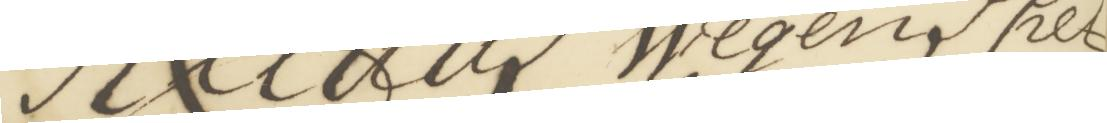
Relaas wegens het
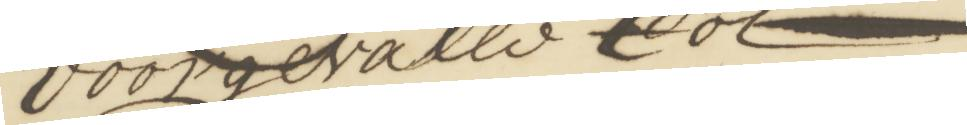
voorgevalle tot
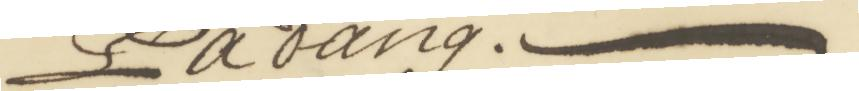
Padang. —
